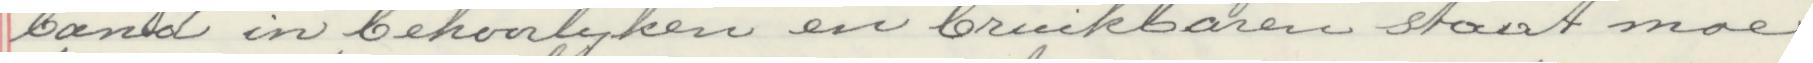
band in behoorlyken en bruikbaren staat moe
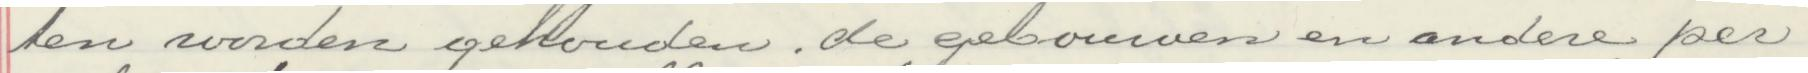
ten worden gehouden, de gebouwen en andere per
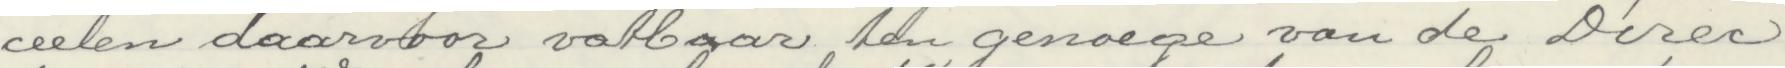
ceelen daarvoor vatbaar ten genoege van de Direc
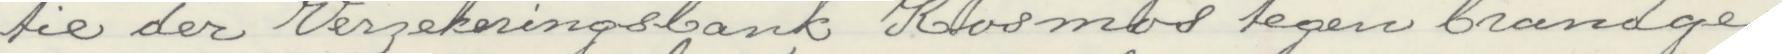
tie der Verzekeringsbank Kosmos tegen brandge
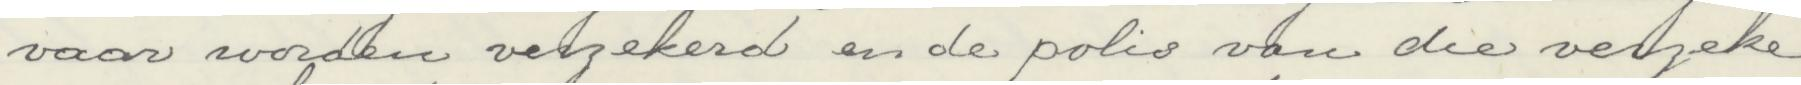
vaar worden verzekerd en de polis van die verzeke
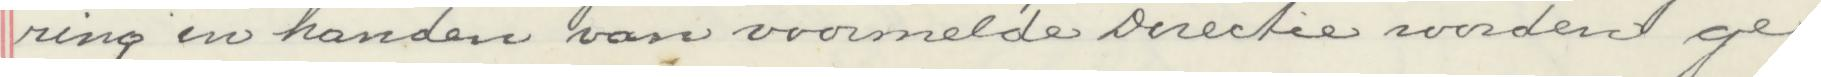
ring in handen van voormelde Directie worden ge
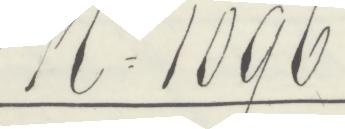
N=o 1096
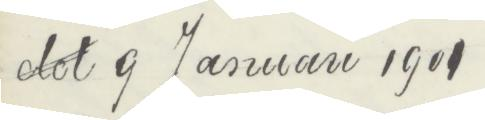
dd 9 Januari 1901
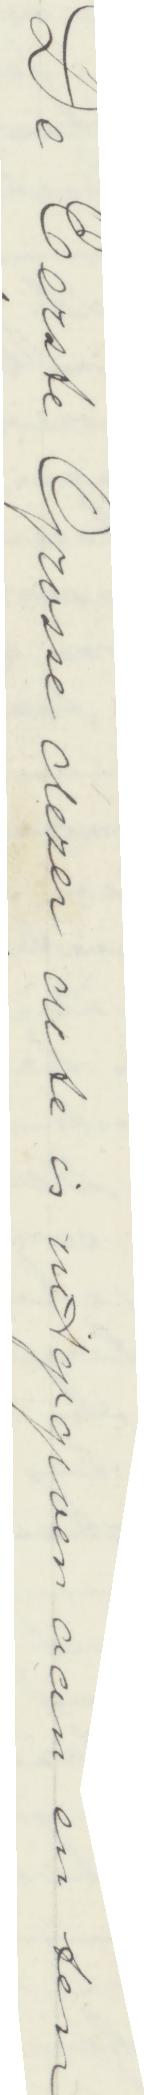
De Eerste Grosse dezer acte is uitgegaen aan en ten
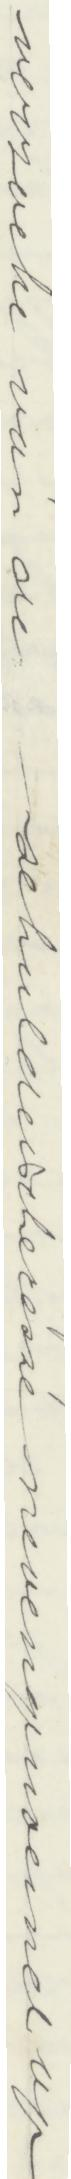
verzoeke van de schuldeischeresse nevengenoemd op
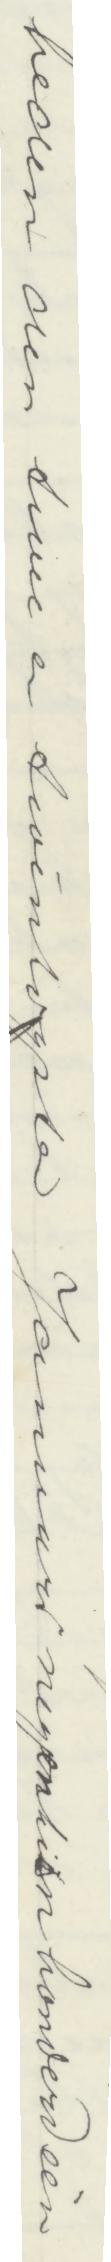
heden den twee en twintigsten Januari negentien honderd één
